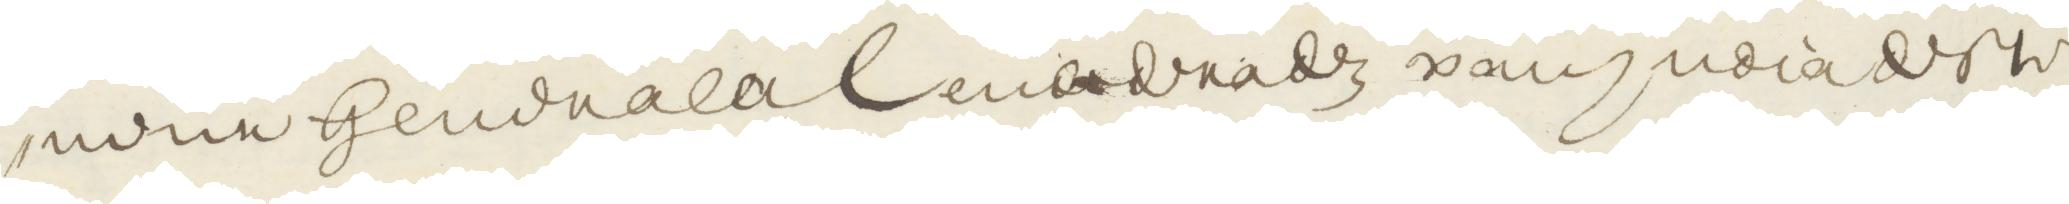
„neur generalal ende de raden van jndia des te
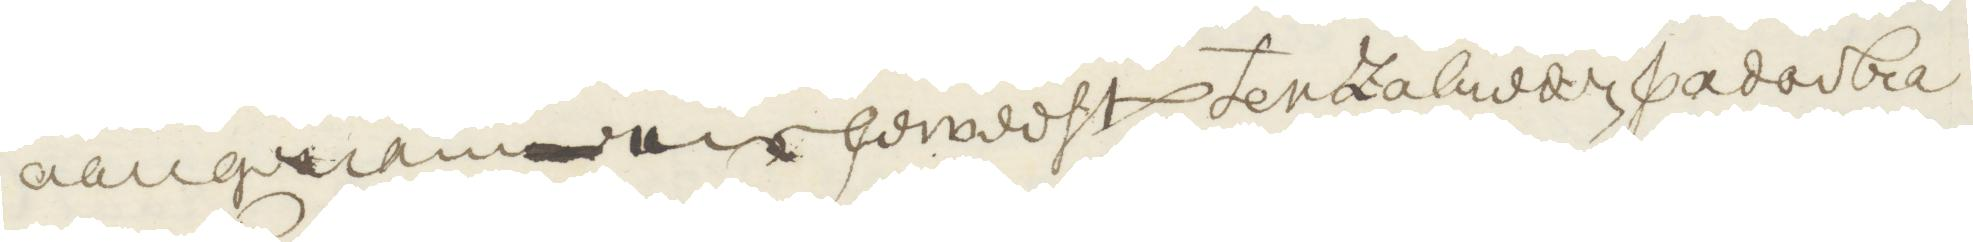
aangenamer is geweest ter Zake den padoeka
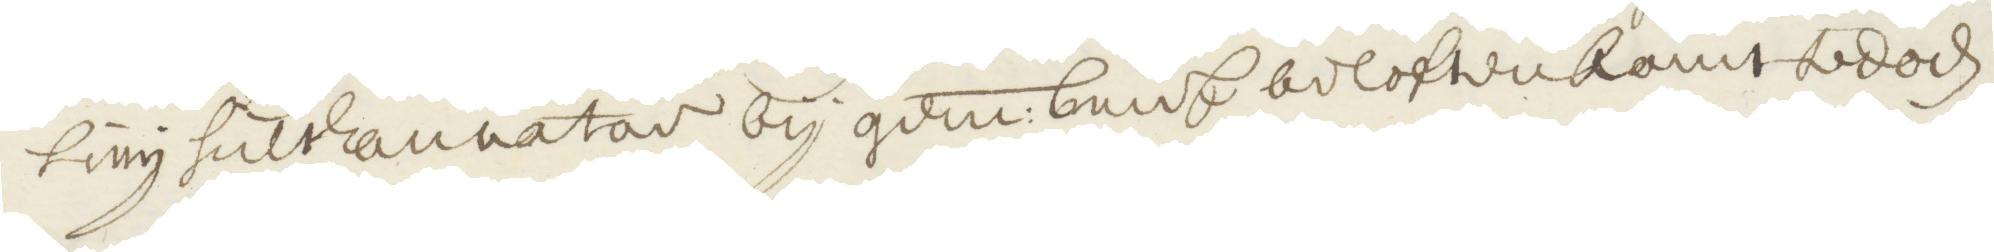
Sirij sulthan ratoe bij gem: brief beloften komt te doen
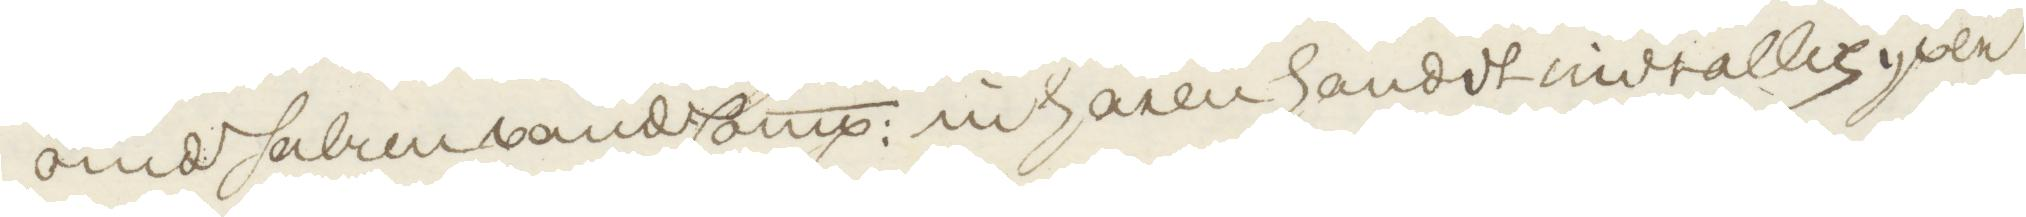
om de saken vande Comp: in haren handel met allen yver
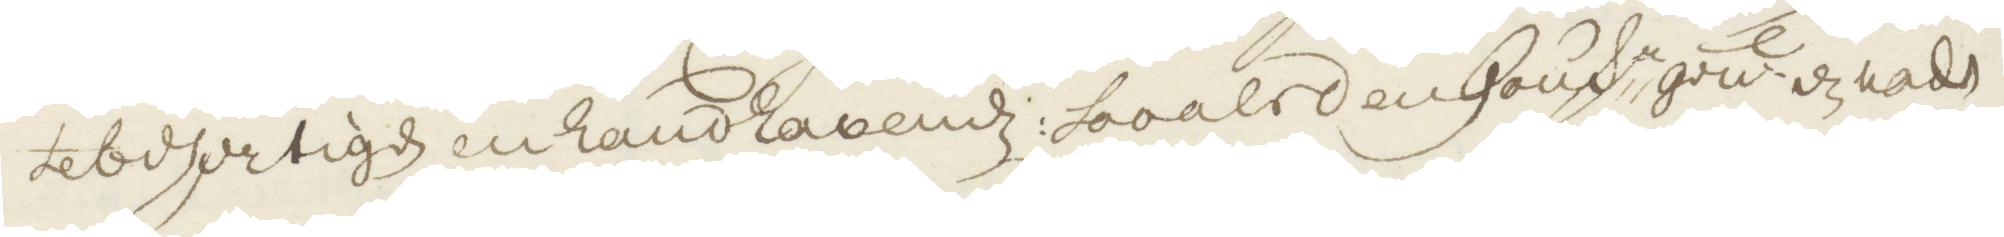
te behertigen en handhavenen: soo als den Gouver„r gen:l en raden
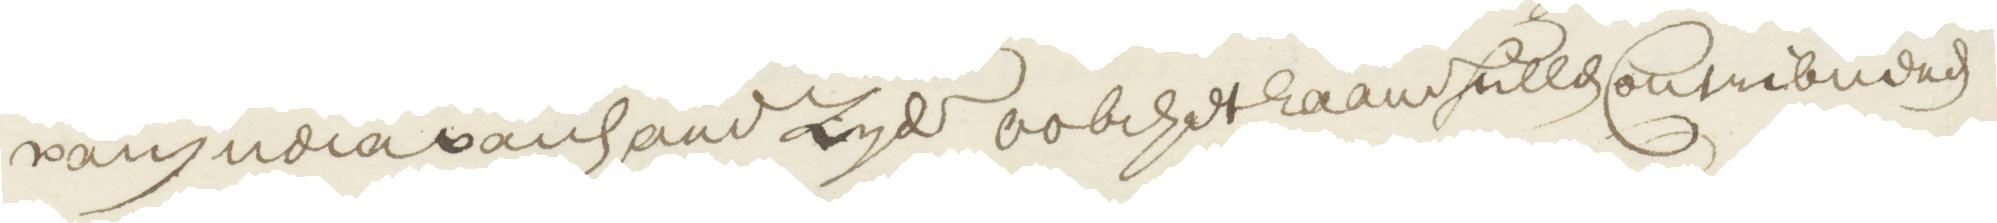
van jndia van hare Zyde ook het haare sulle contribueren
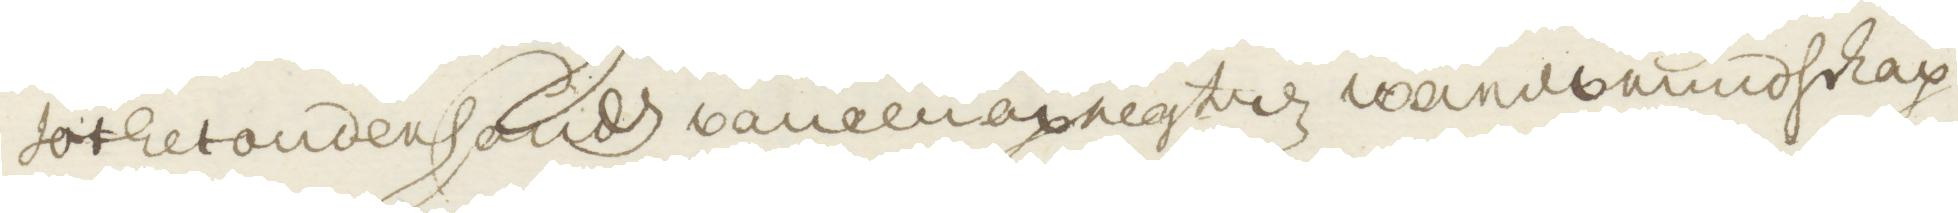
tot het onderhouden van een opregten ware vrundschap
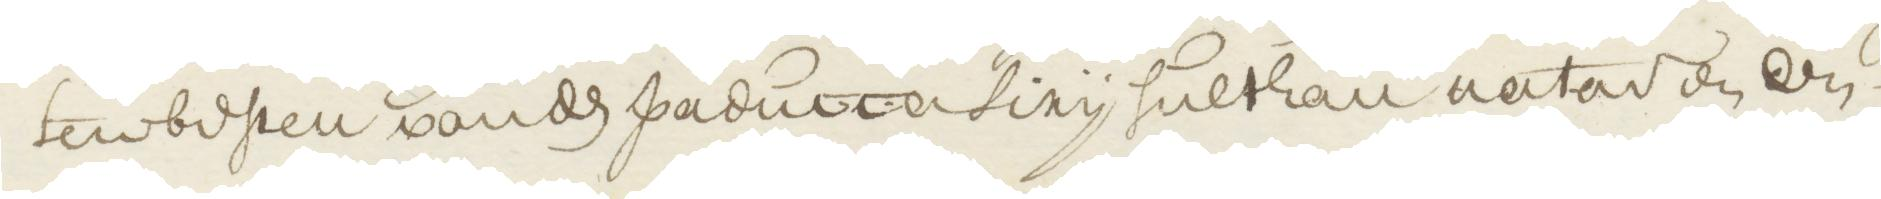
ten besten van den paducca sirij sulthan ratoe en den
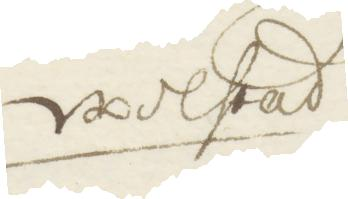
welstad
